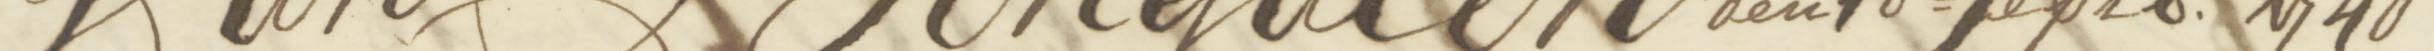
Van Bengalen den 18:' Septb: 1740
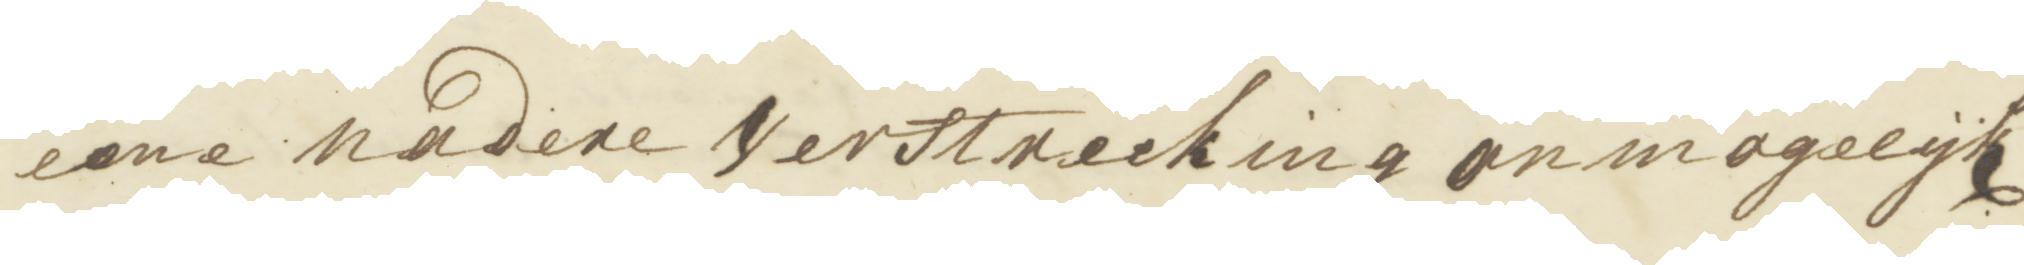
eene nadere verstrecking onmogelijk
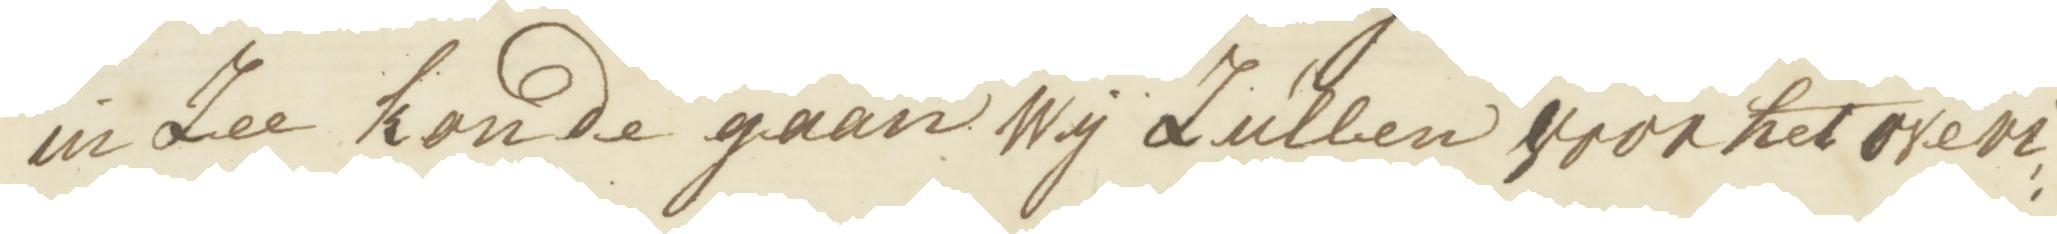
in zee konde gaan wij zullen voor het overi„
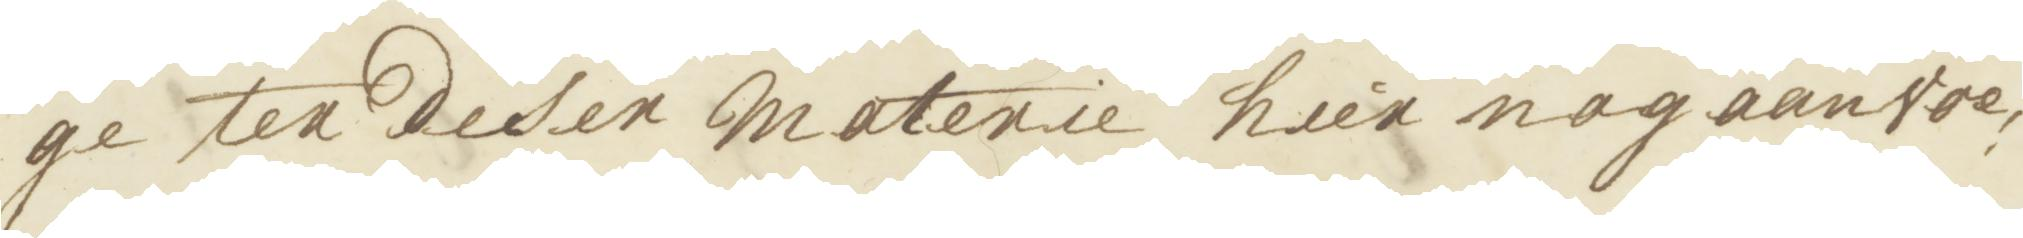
ge ter deser materie hier nog aanvoe„
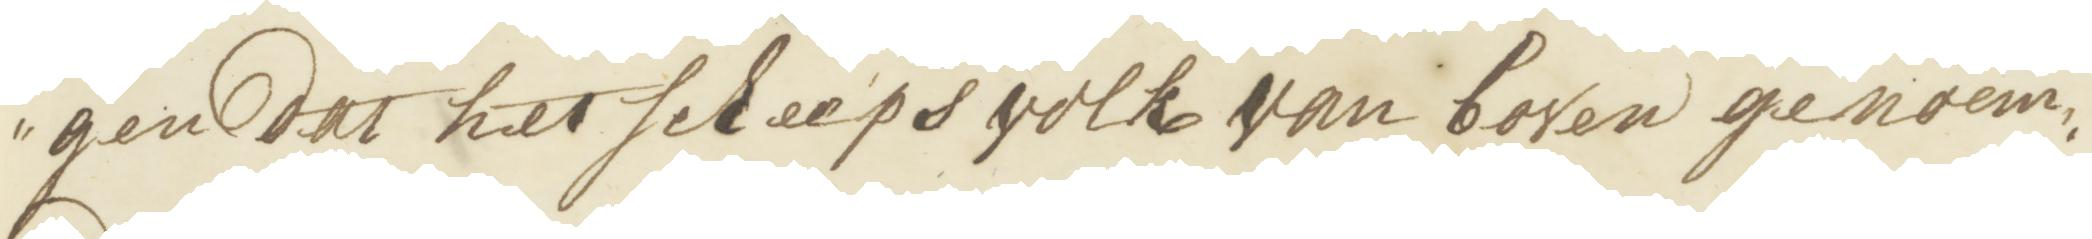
„gen dat het scheeps volk van boven genoem„
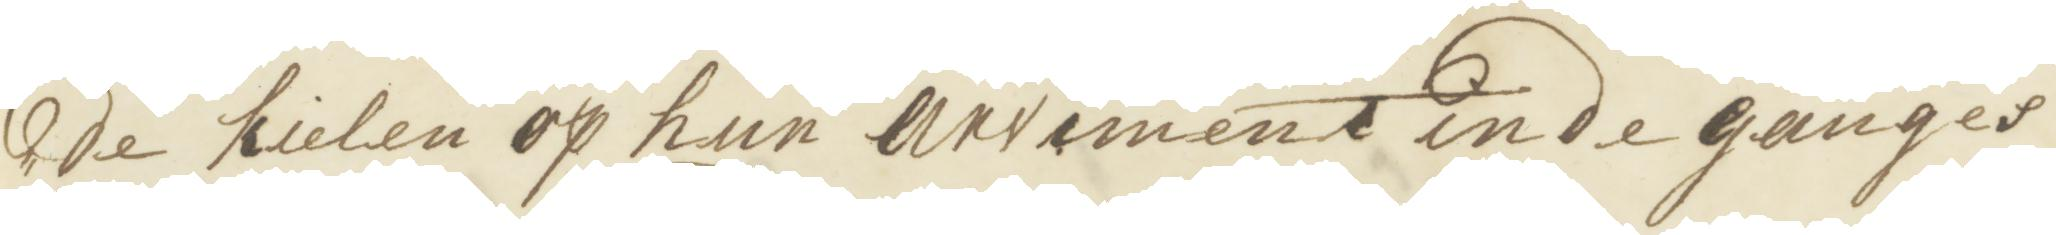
de kielen op hun arviment in de ganges
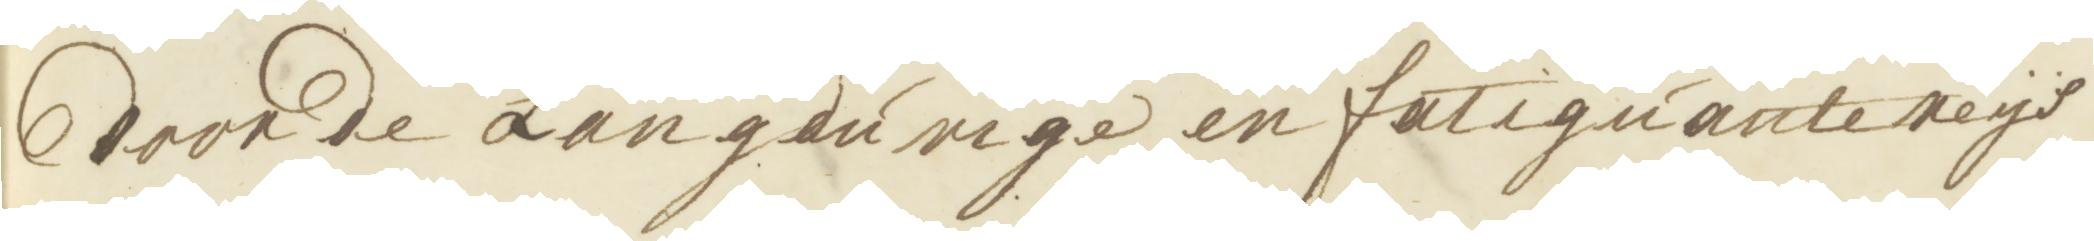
door de langdurige en fatiguante reijs
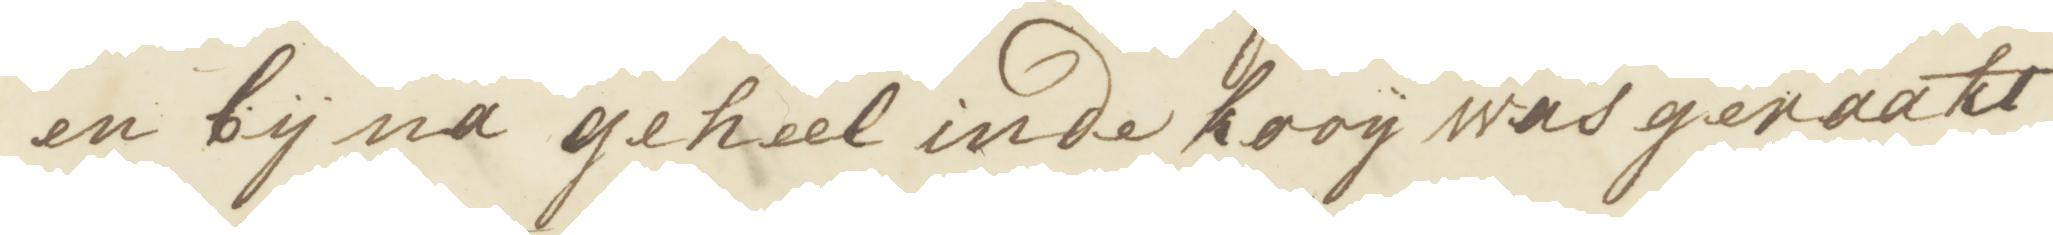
en bij na geheel inde kooij was geraakt
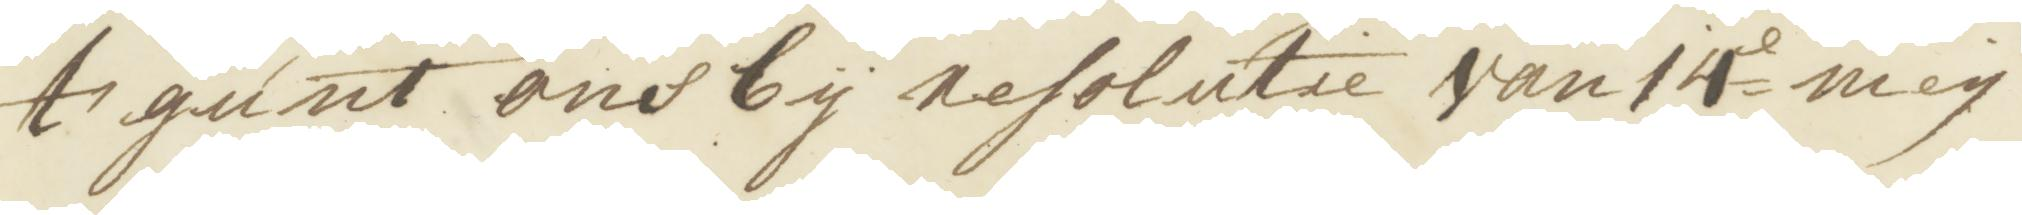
t: gunt ons bij resolutie van 14=e meij
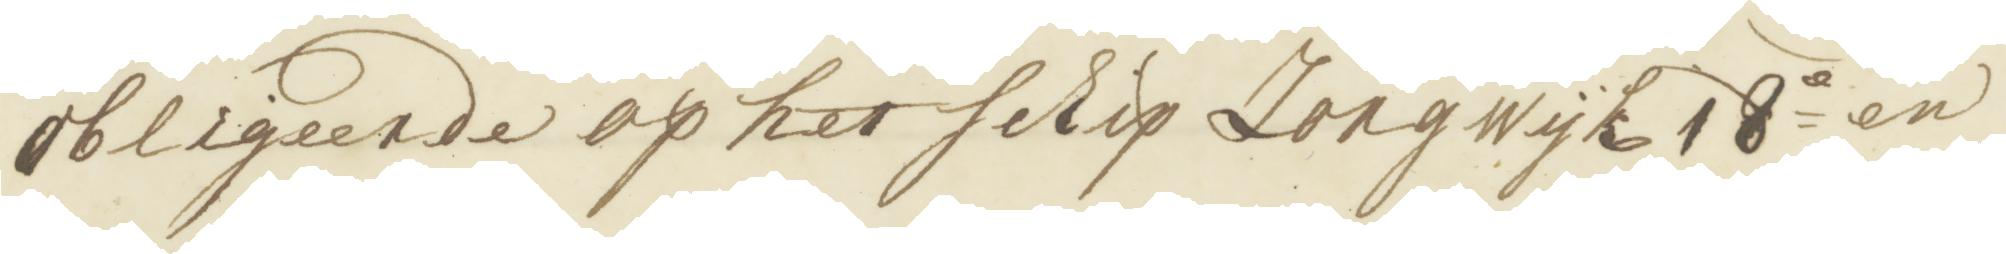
obligeerde op het schip Zorgwijk 18=e en
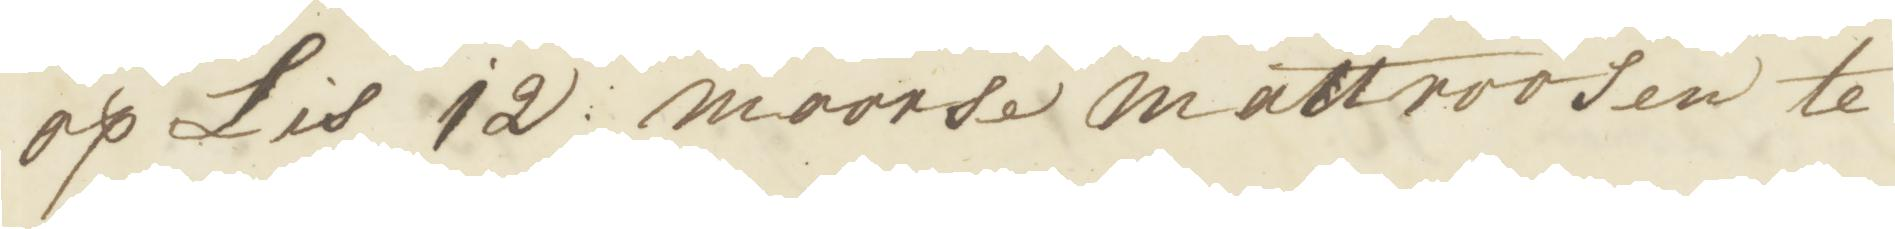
op Lis 12: moorse mattroosen te
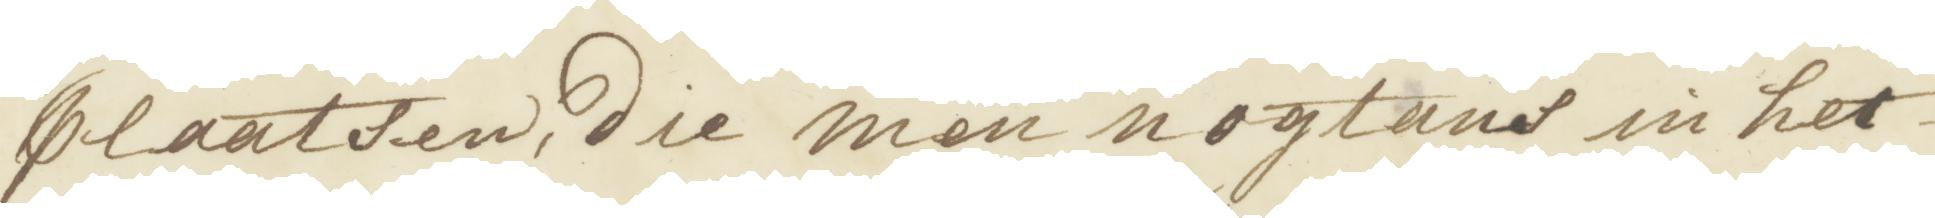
plaatsen, die men nogtans in het
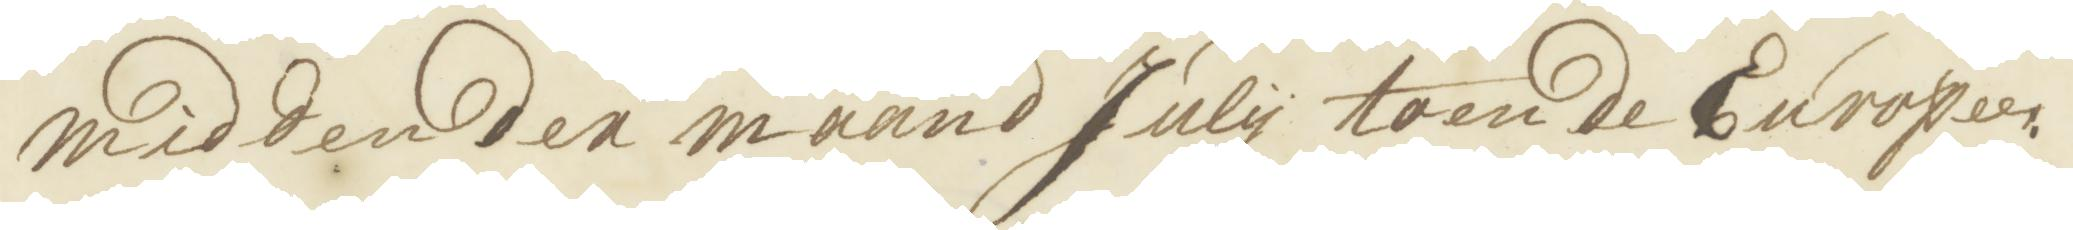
midden der maand Julij toen de Europee„
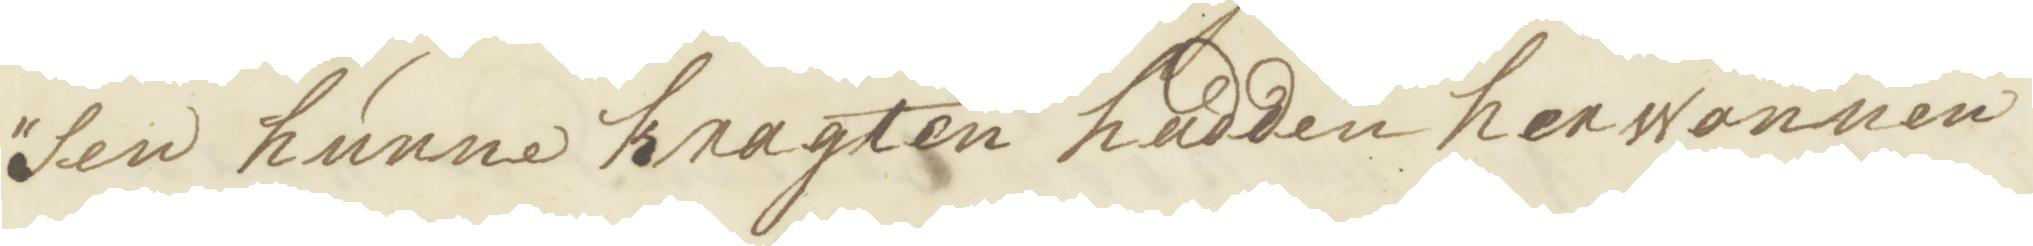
„sen hunne kragten hadden herwonnen
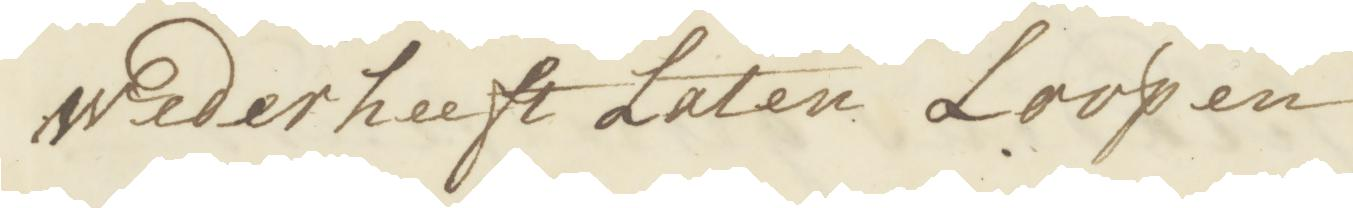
weder heeft laten loopen
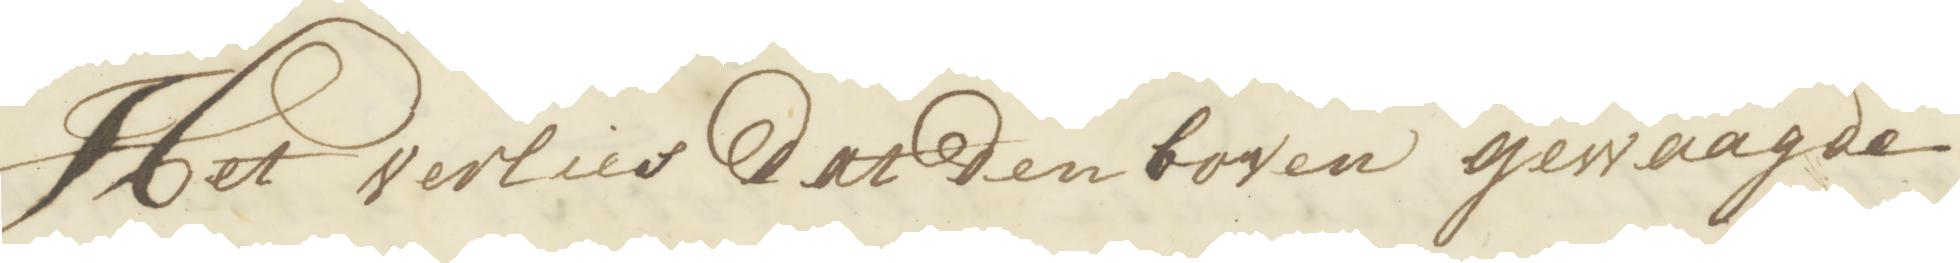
Het verlies dat den boven gewaagde
